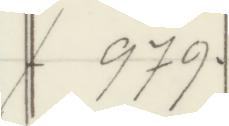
ƒ 979
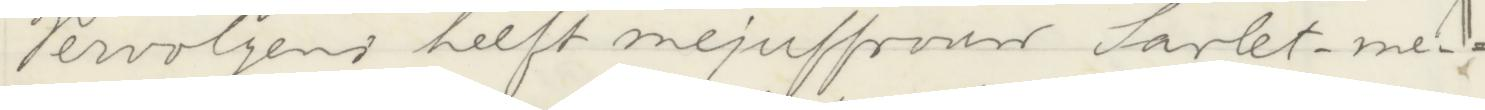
Vervolgens heeft mejuffrouw sarlet -me-
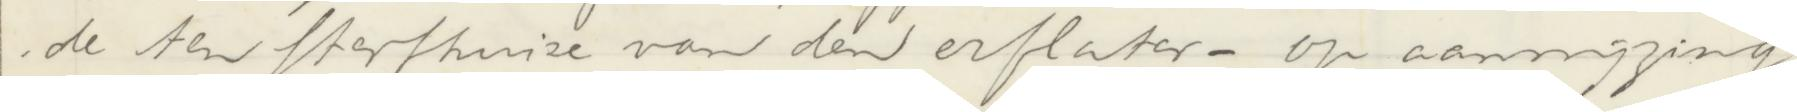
de ten sterfhuize van den erflater- op aanwijzing
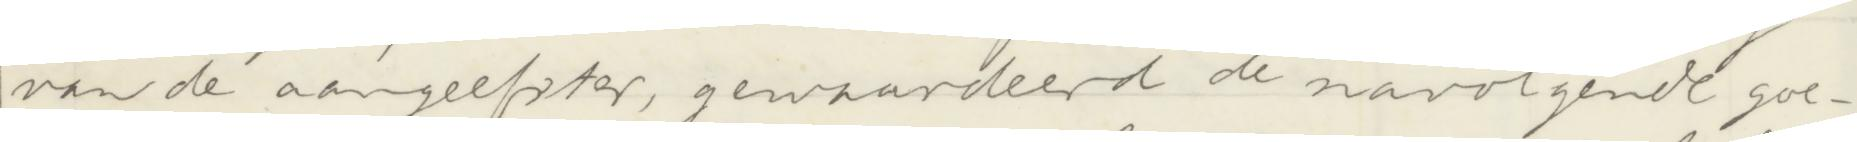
van de aangeefster, gewaardeerd de navolgende goe-
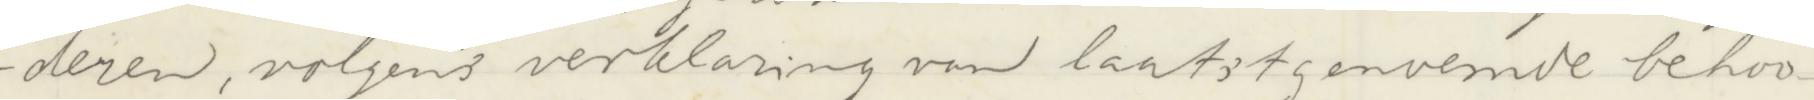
-deren, volgens verklaring van laatstgenoemde behoo
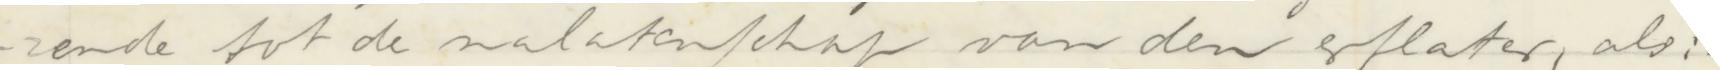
-rende tot de nalatenschap van den erflater, als:
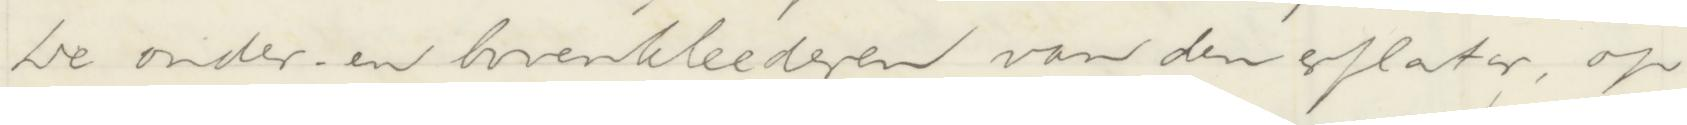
De onder en bovenkleederen van den erflater, op
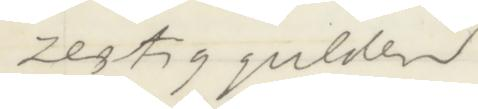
zestig gulden
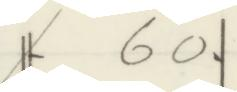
ƒ 60.
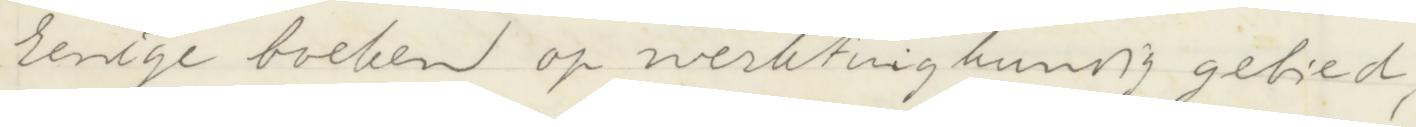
Eenige boeken op werktuigkundig gebied,
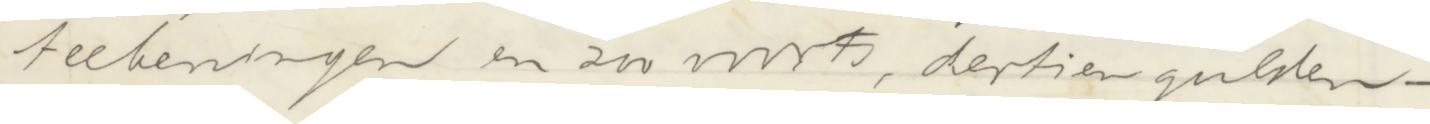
teekeningen en zo voorts, dertien gulden
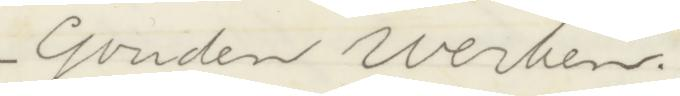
-Gouden Werken.
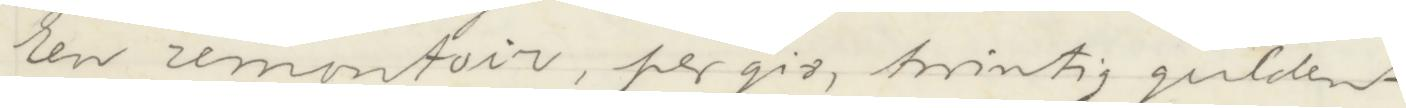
Een remontoir, per gis, twintig gulden-
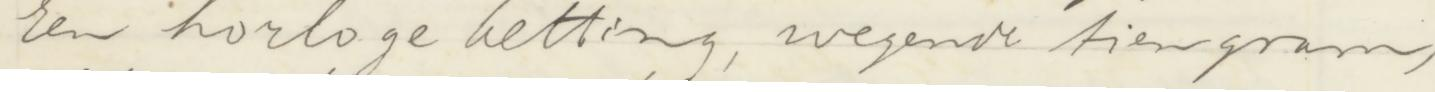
Een horloge ketting, wegende tien gram,
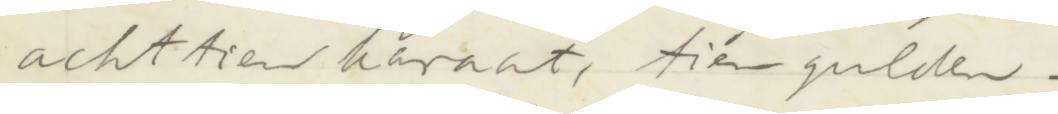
achttien karaat, tien gulden
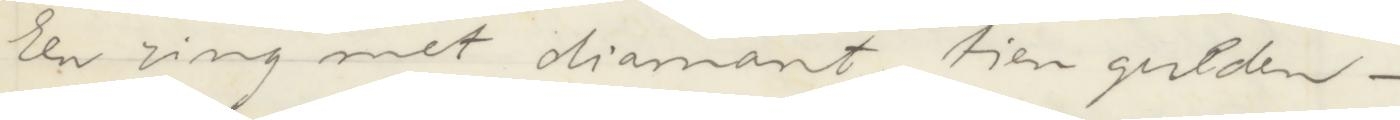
Een ring met diamant, tien gulden—
